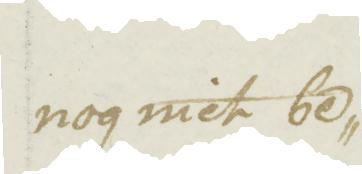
nog niet be„
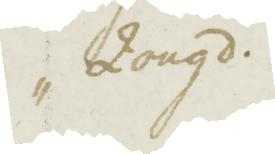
„ zorgd.
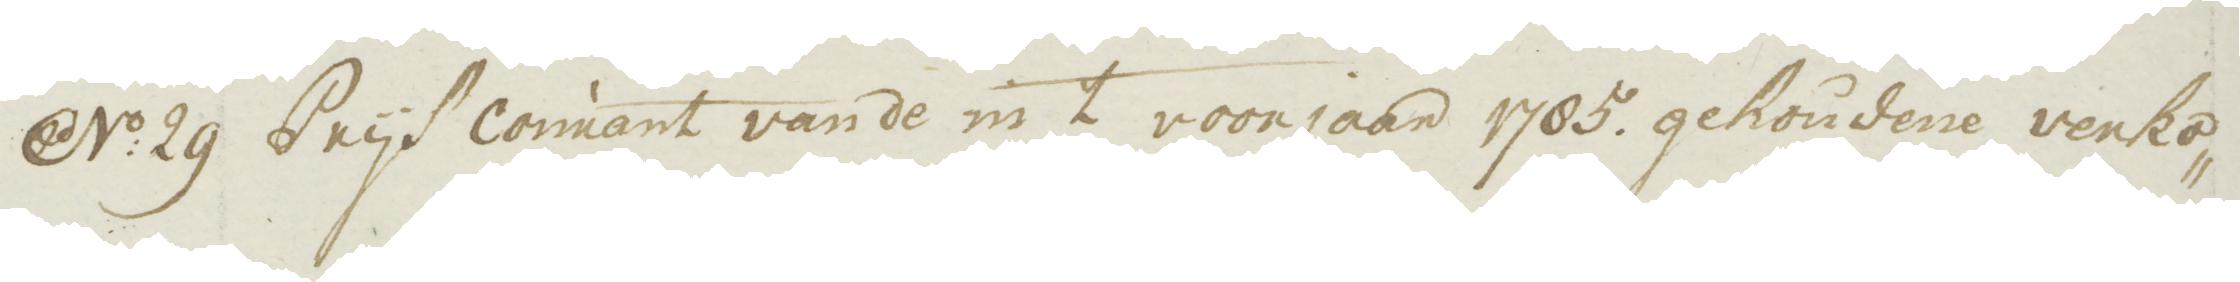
N:o 29 Prijs courant van de in ’t voorjaar 1785. gehoudene verko„
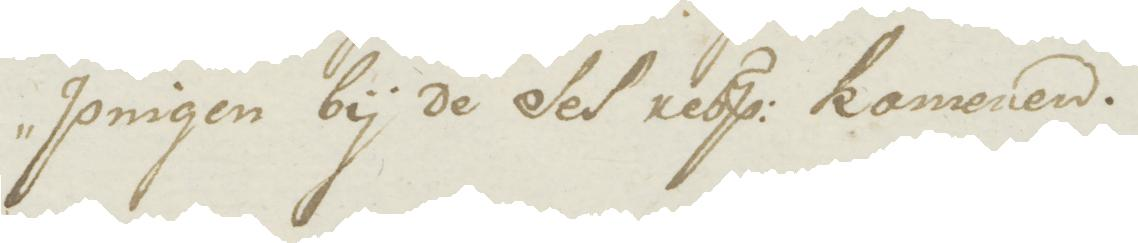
„pingen bij de ses resp: kameren.
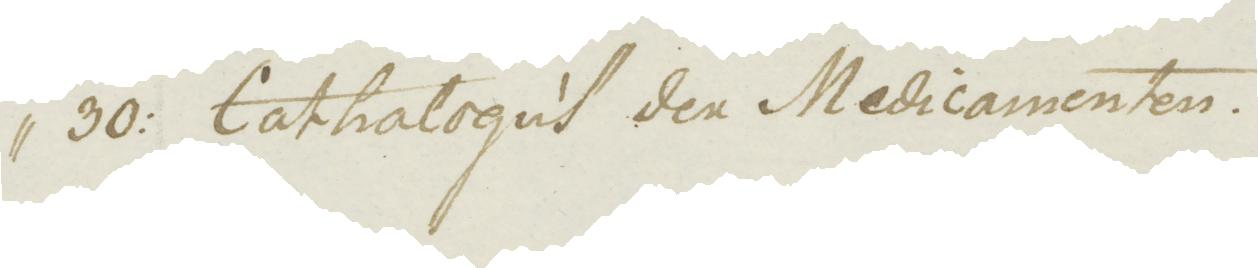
„ 30: Cathalogus der Medicamenten.
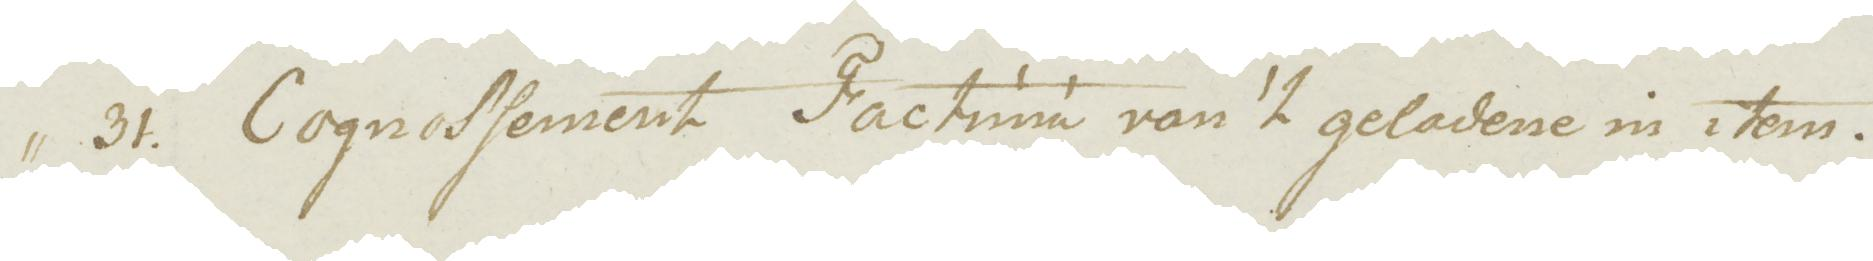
„ 31. Cognossement Factuur van ’t geladene in item.
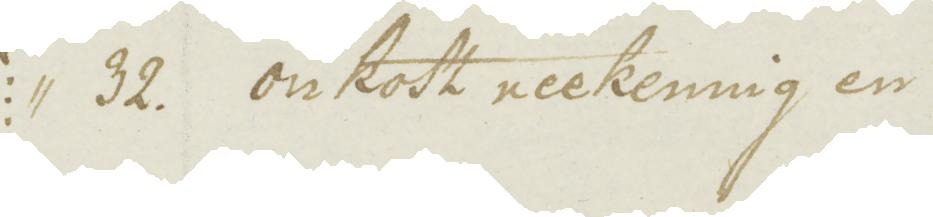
„ 32. onkost reekening en
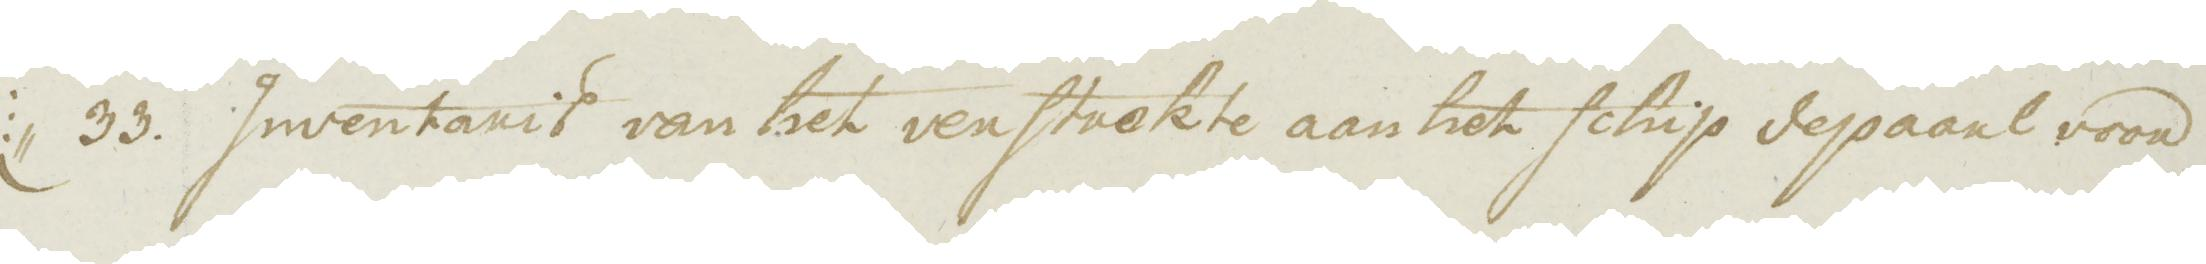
(:„ 33. Jnventaris van het verstrekte aan het schip depaarl voor
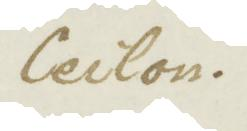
Ceilon.
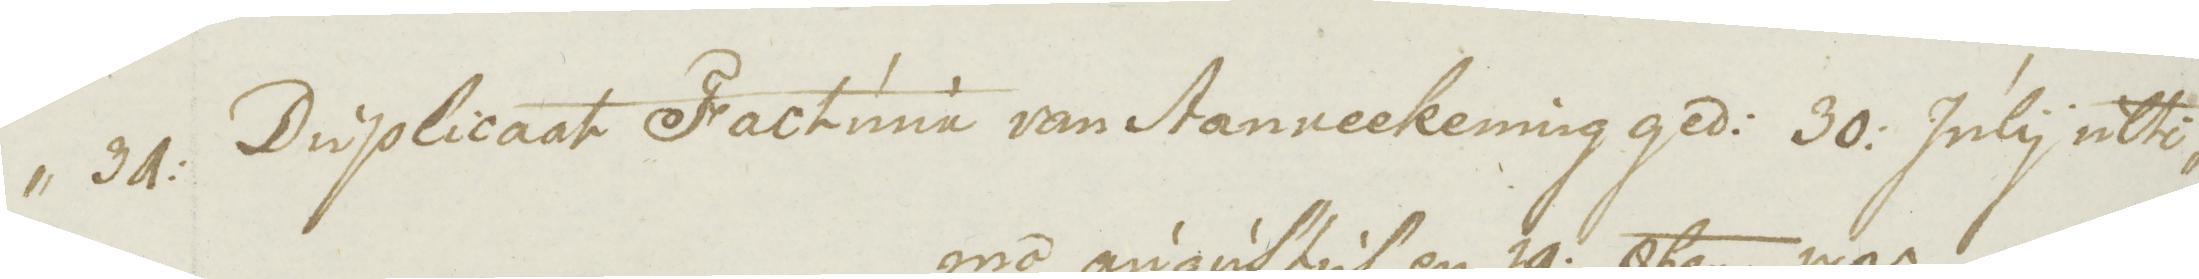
„ 34: Duplicaat Factuur van Aanreekening ged: 30: Julij ulti
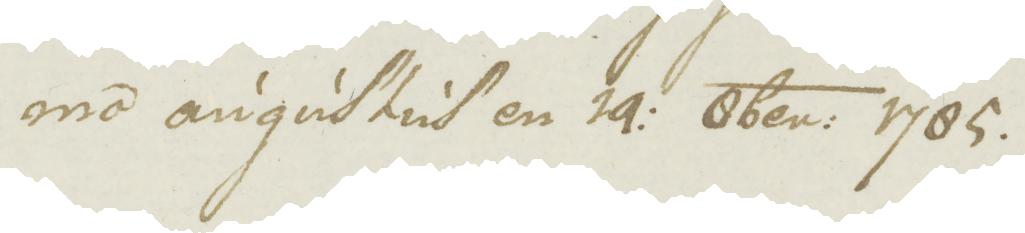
mo augustus en 14: 8ber: 1785.
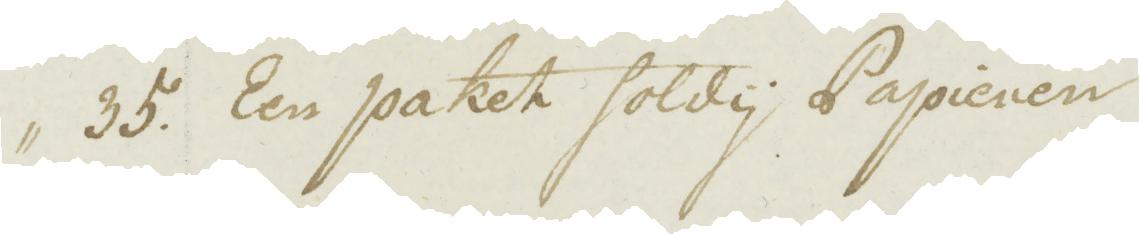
„ 35. Een paket soldij Papieren
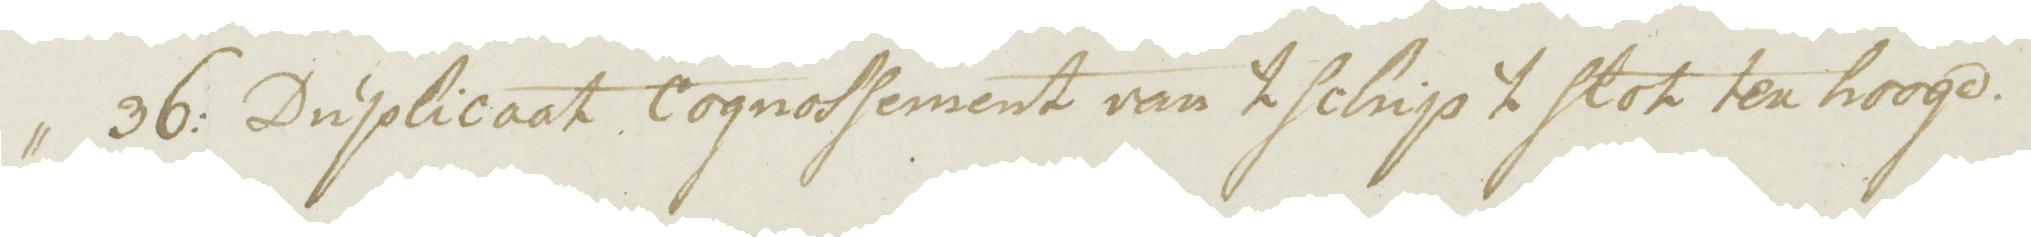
„ 36: Duplicaat Cognossement van ’t schip ’t slot ter hooge.
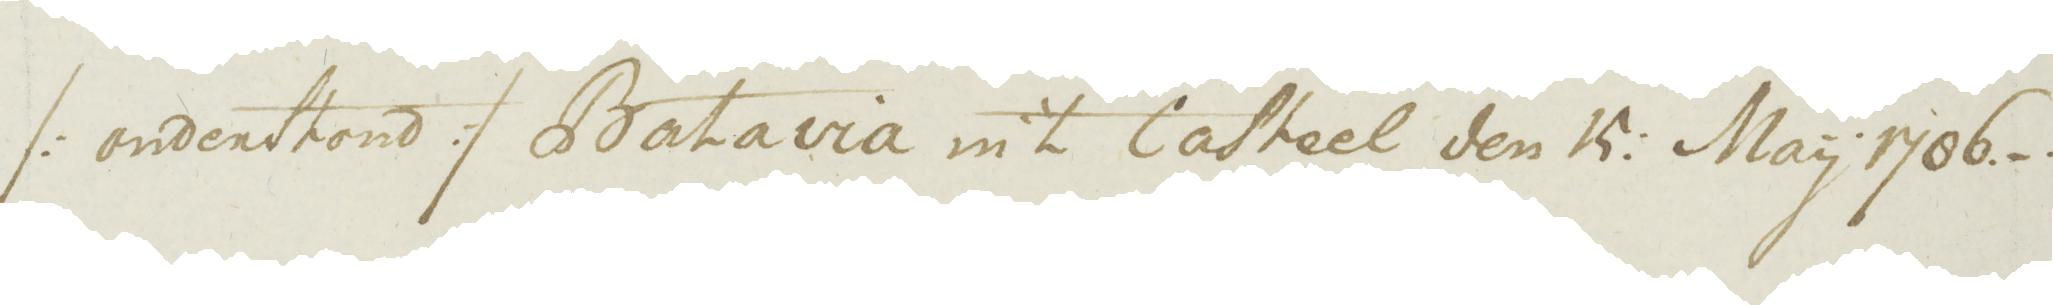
/:onderstond:/ Batavia in ’t Casteel den 15: Maij 1786.-.
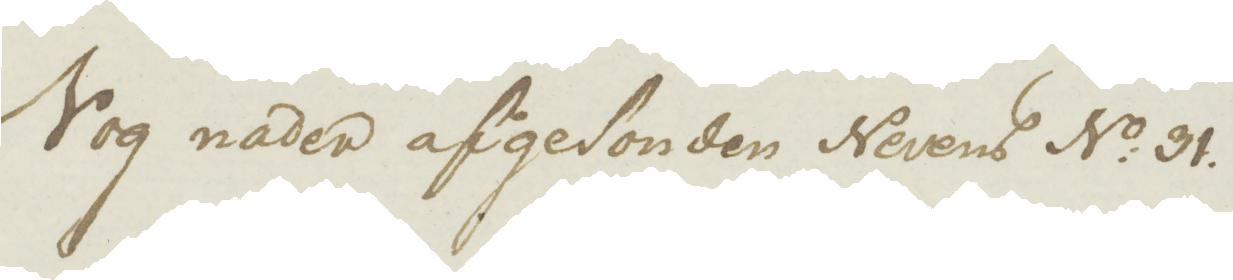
Nog nader afgesonden Nevens N:o 31.
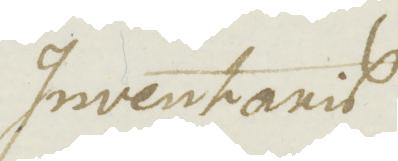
Jnventaris
